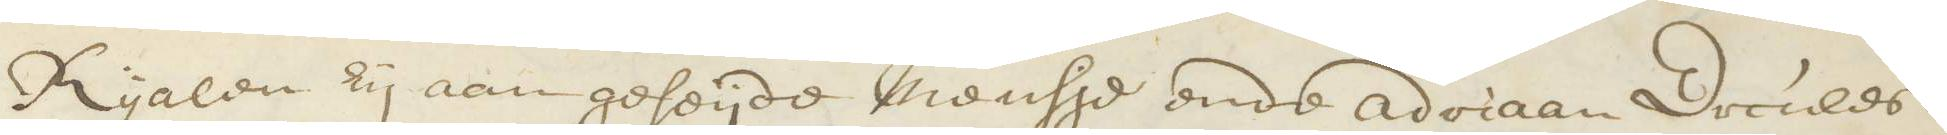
Rijalen hij aan geseijde mensje ende adriaan Ercules
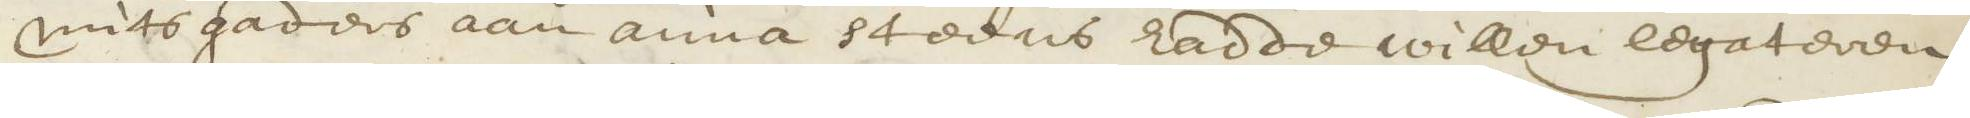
mitsgaders aan anna steens hadde willen legateren
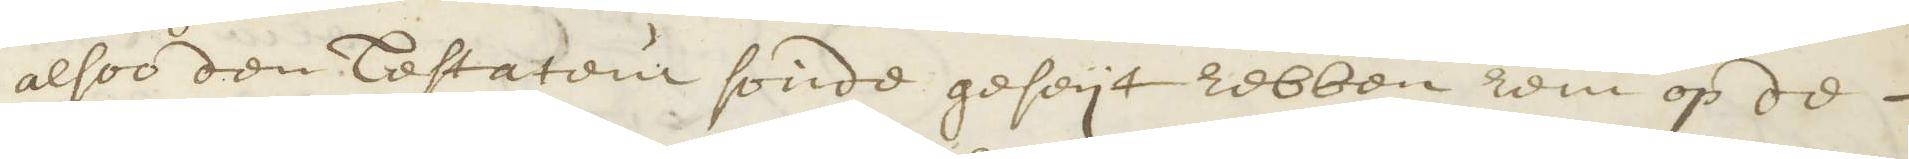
alsoo den Testateur soude geseijt hebben hem op de
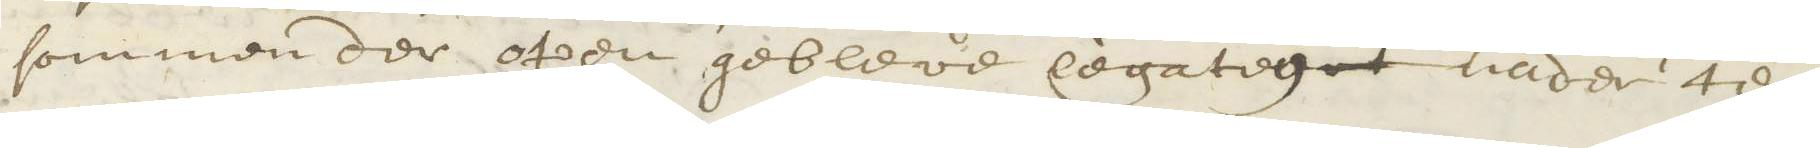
sommen der open gebleve legateert nader te
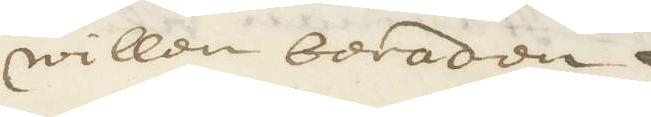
willen beraden
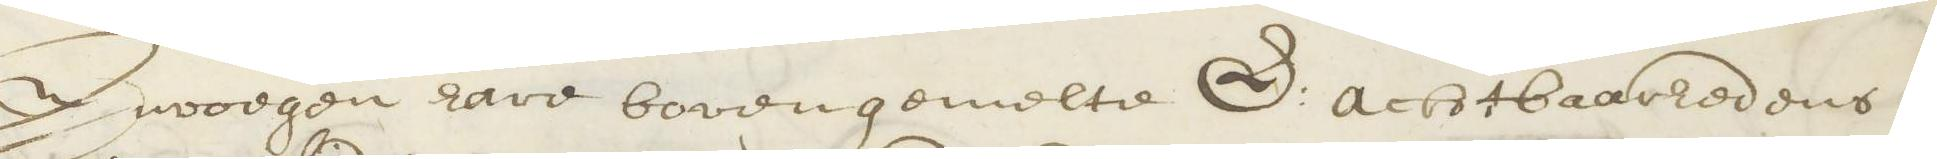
Jnvoegen hare bovengemelte E: achtbaarhedens
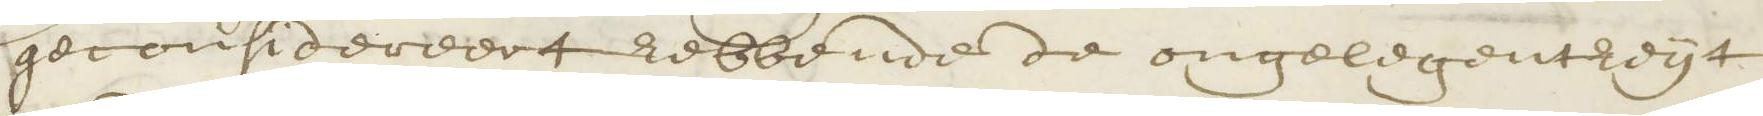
geconsidereert hebbende de ongelegentheijt
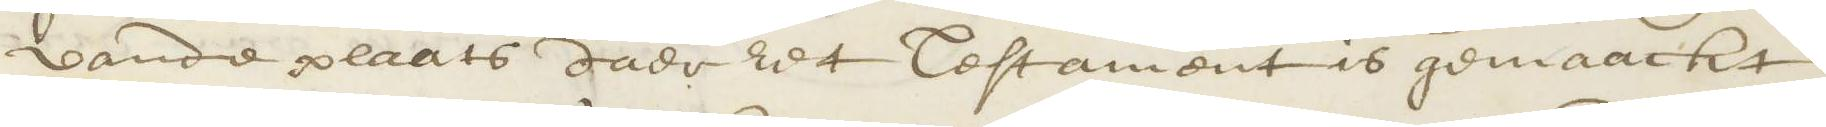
vande plaats daer het Testament is gemaackt
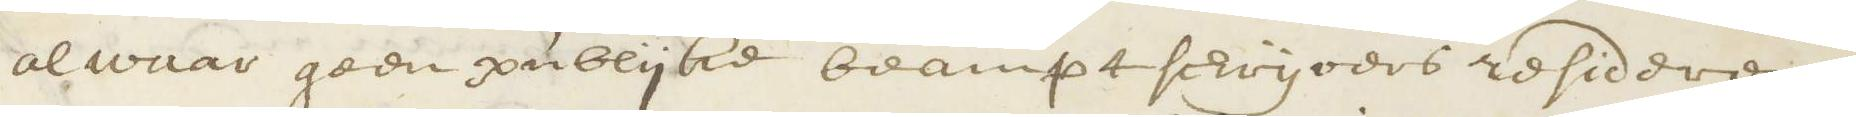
alwaar geen publijke beamptschrijves resideren
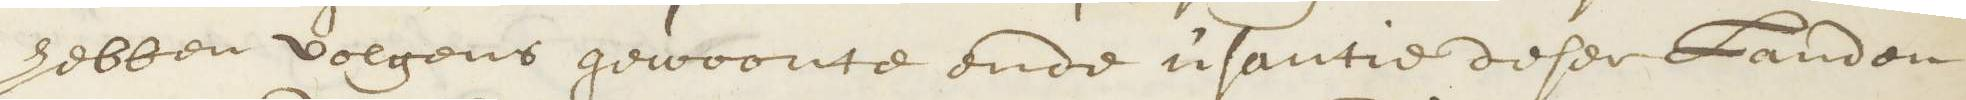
hebben volgens gewoonte ende usantie deser Landen
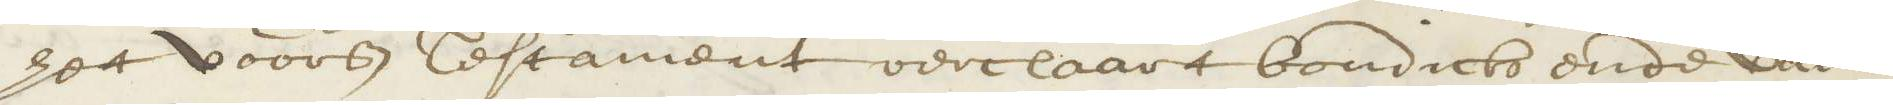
het voorsz Testament verclaart bondich ende van
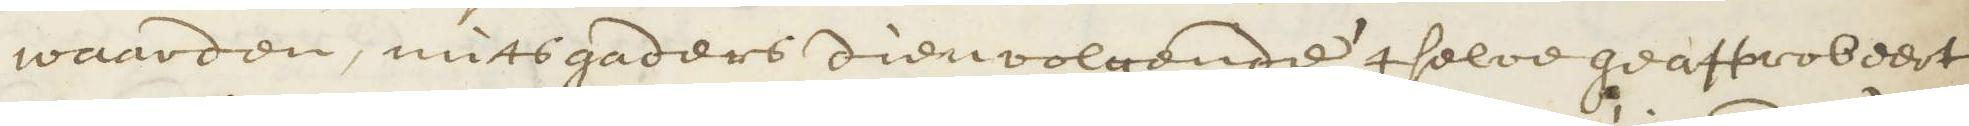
waarden, mitsgaders dien volgende 't selve geapprobeert
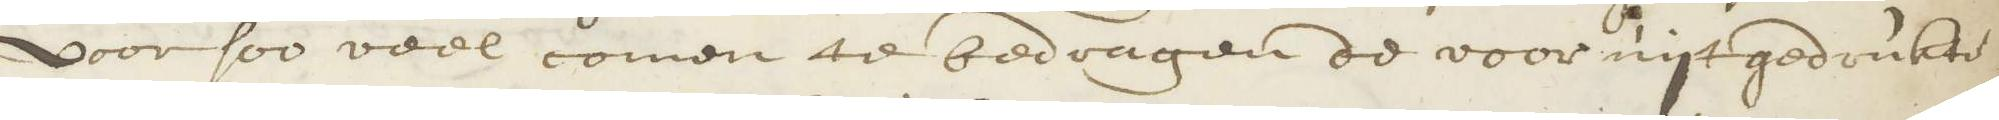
voor soo veel comen te bedragen de voor uijtgedrukte
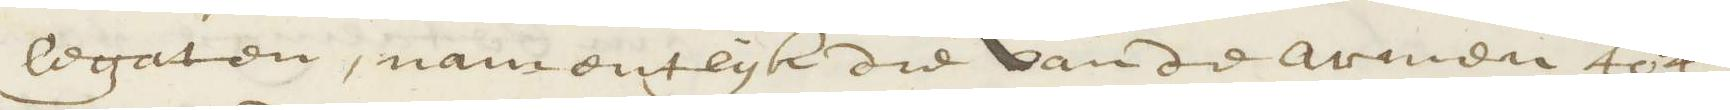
legaten, namentlijk die van de armen tot
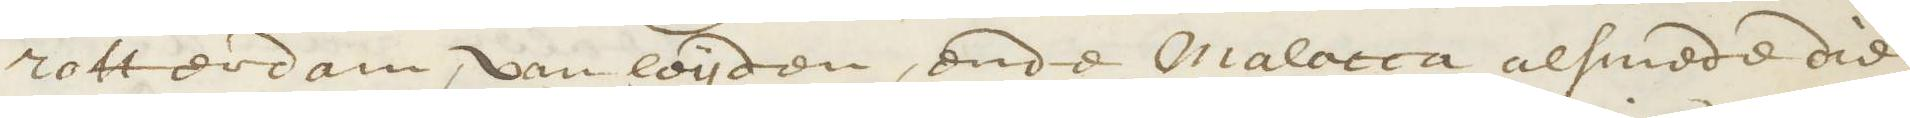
rotterdam, van leijden, ende Malacca alsmede die
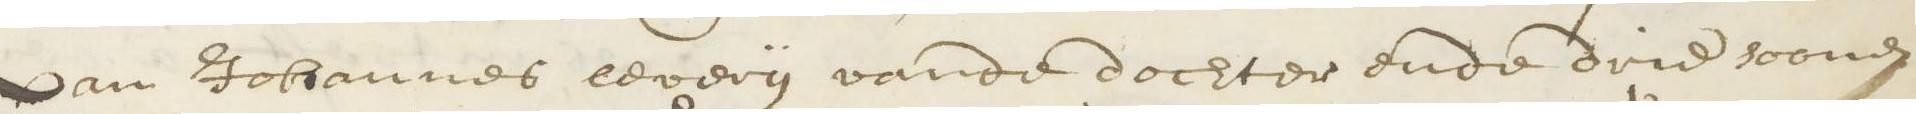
van Johannes leverij vande dochter ende drie soonen
